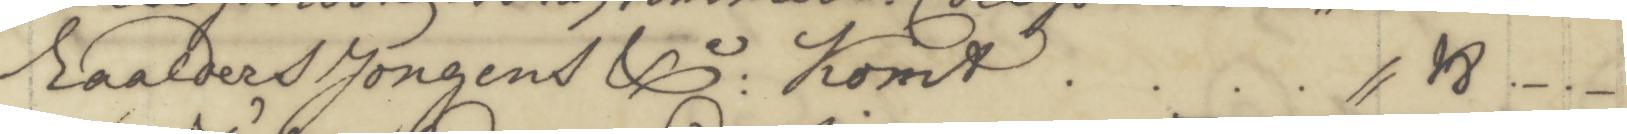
haalders Jongens &:a komt - - - - „ 18. —. —
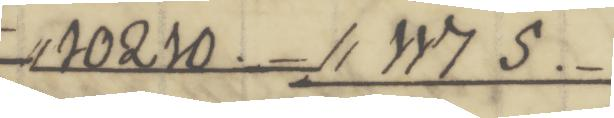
„10210. — „ 117 5. —
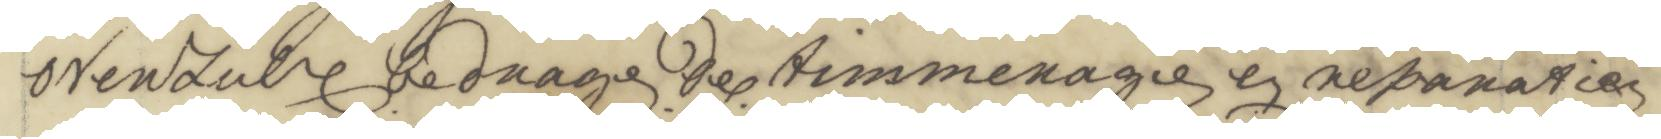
over zulx bedragen de timmeragien en reparatien
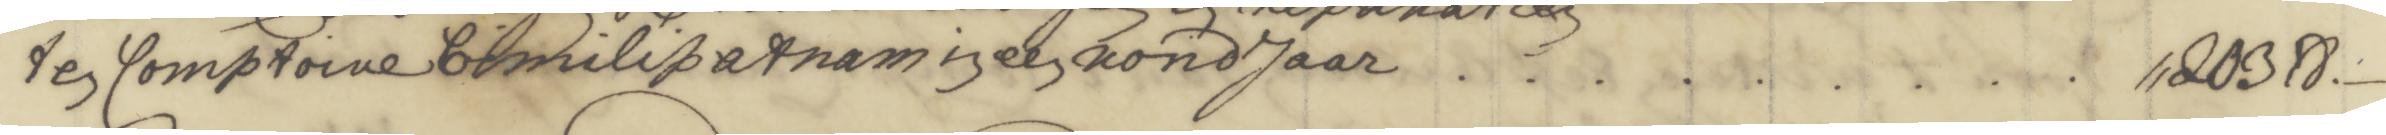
ten Comptoire bimilipatnam in een rond Jaar - - - - - - - - - „20318. —
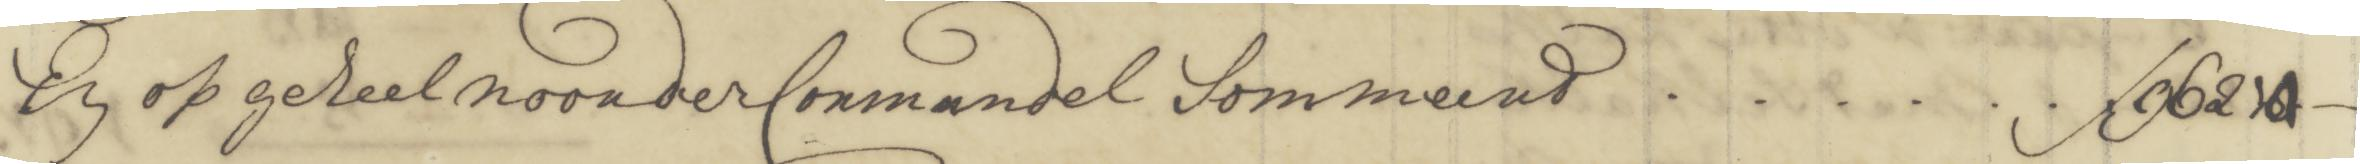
En op geheel noorder Cormandel sommeerd - - - - - - ƒ962 14. —
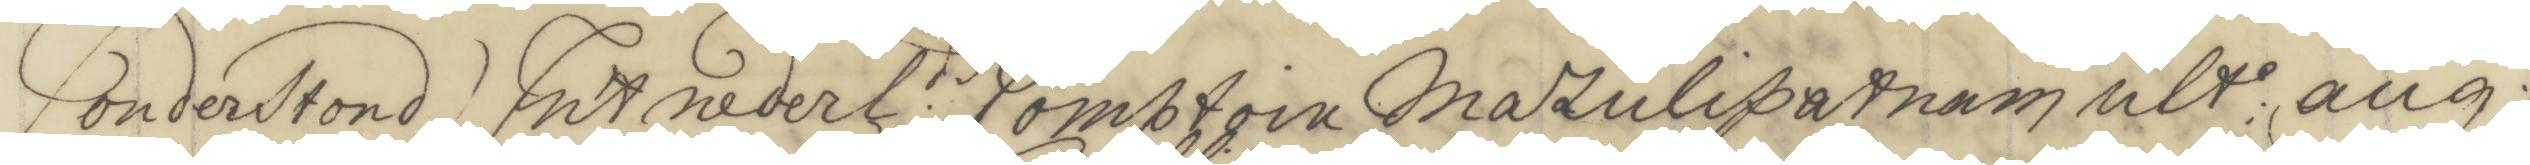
(onderstond) Jn 't nederl:ds Comptoir Mazulipatnam ult:o aug.
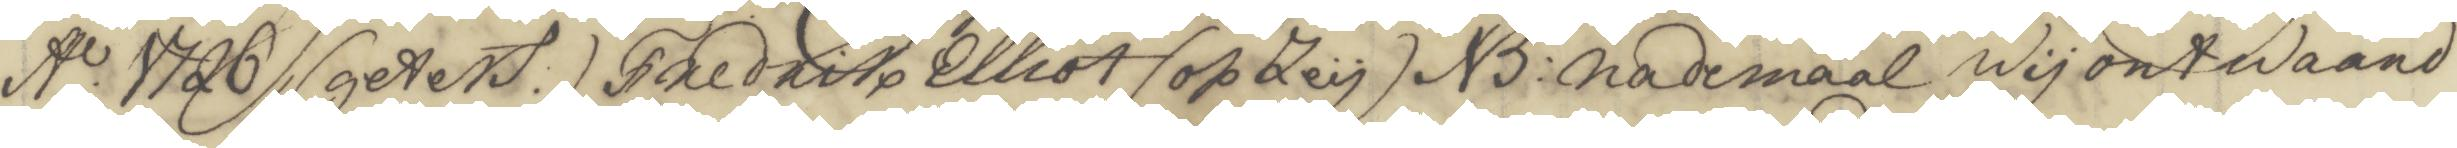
A:o 1726 (getekt:) Fredrik Elliot (op zeij) NB: nademaal wij ontwaard
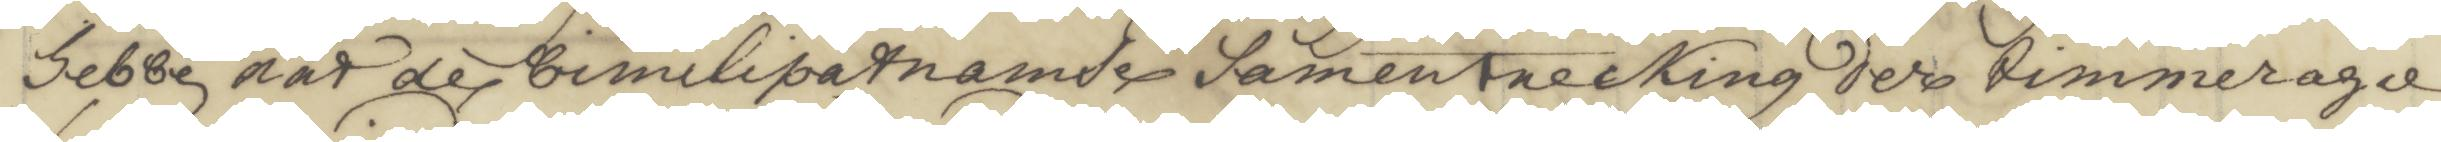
hebben dat de bimilipatnamse samentrecking der timmeragie
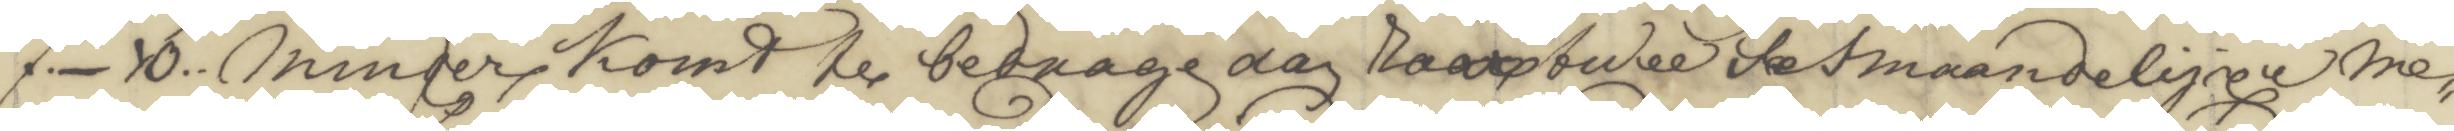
ƒ. — 10.. minder komt te bedragen dan Raar twee sesmaandelijxe me
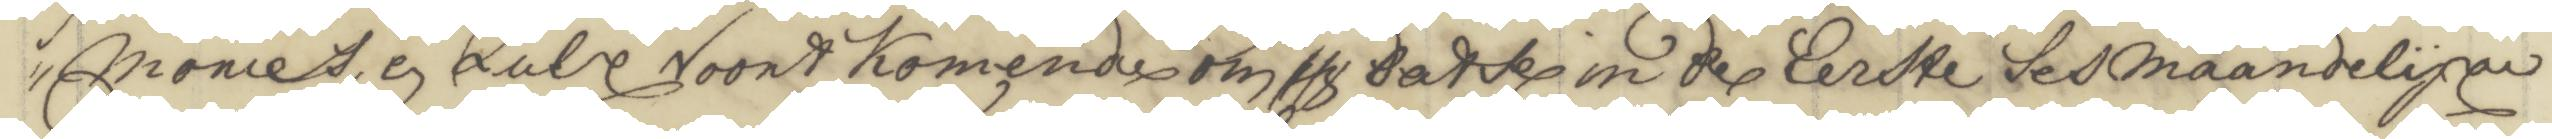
„mories, en zulx voort komende om ten datse in de Eerste ses maandelijxe
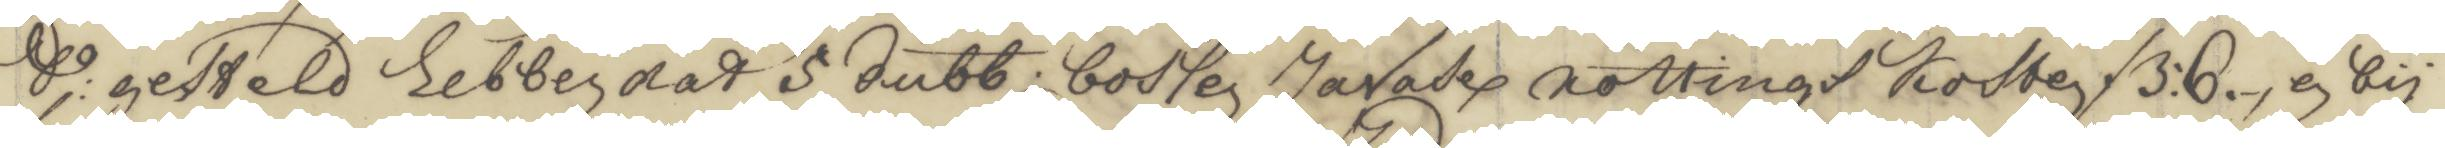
d:o gesteld hebben dat 5 dubb: bossen Javase rottings kosten ƒ 3: 6. —, en bij
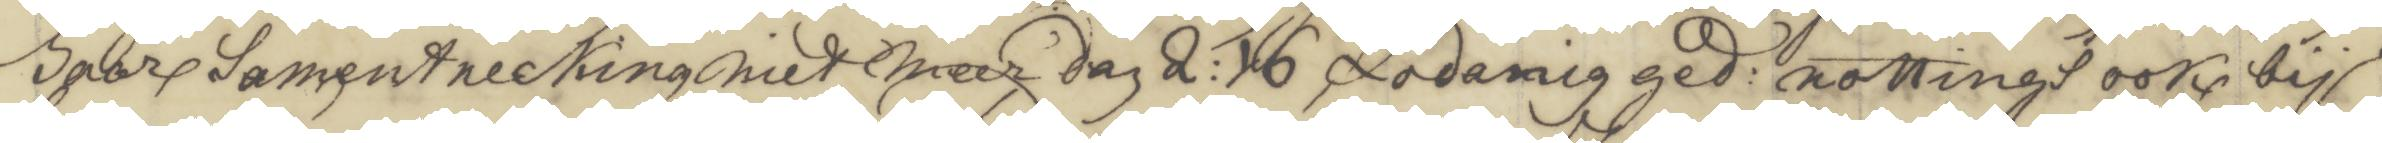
haar samentrecking niet meer dan 2: 16, zodanig ged: rottings ook bij
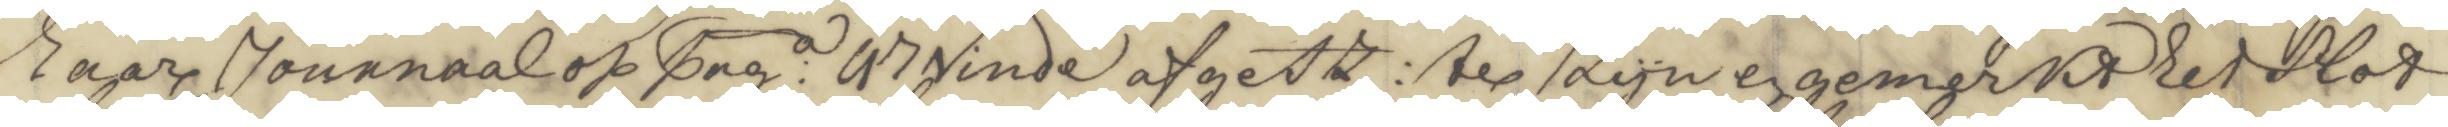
haar Journaal op pag:a 47 Vinde afgesz: te zijn en gemerkt het slot
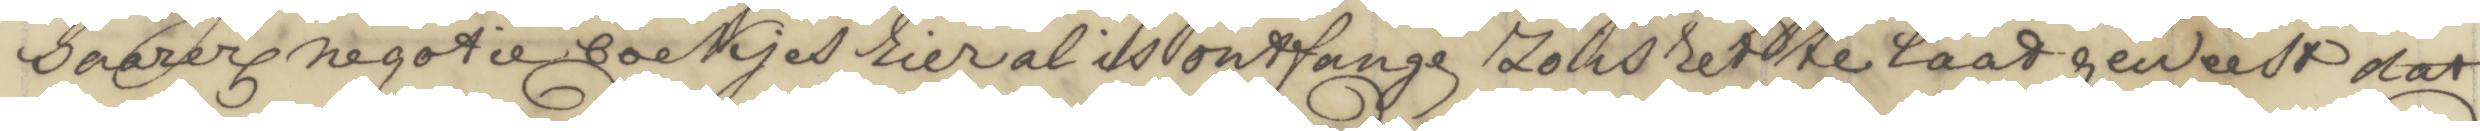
haarer negotie boekjes hier al is ontfangen zo is het te laat geweest dat
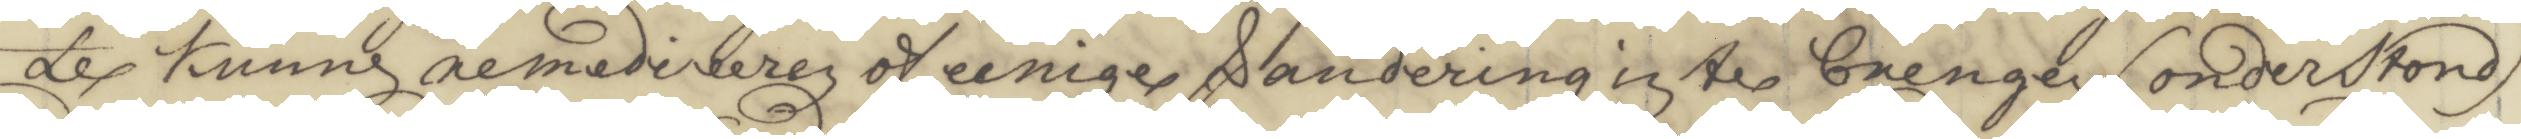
te kunnen remedieeren of eenige verandering in te brengen (onderstond)
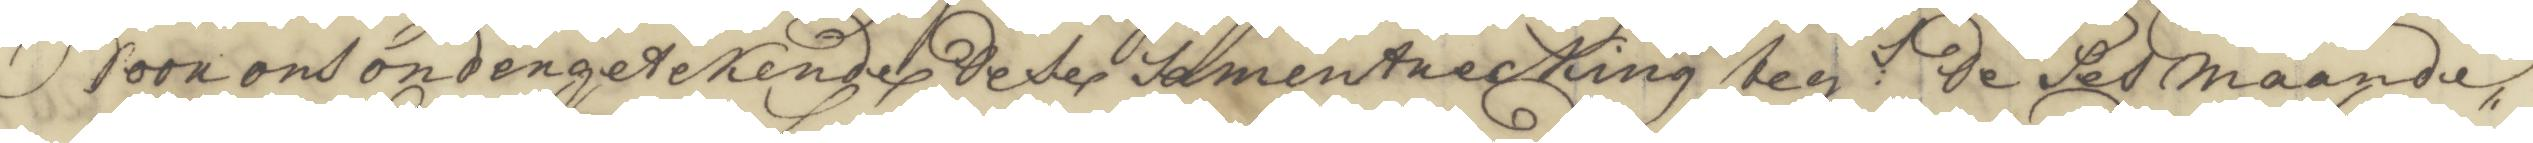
door ons onder getekende dese samentrecking teg:s de ses maande„
